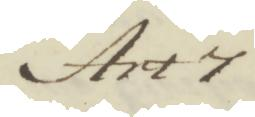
Art 7
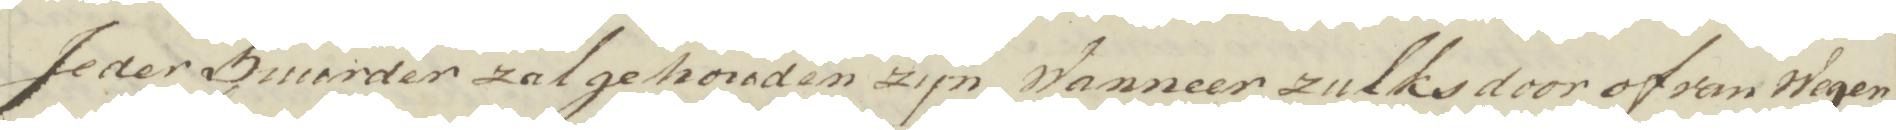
Jeder huurder zal gehouden zyn, wanneer zulks door of van wegen
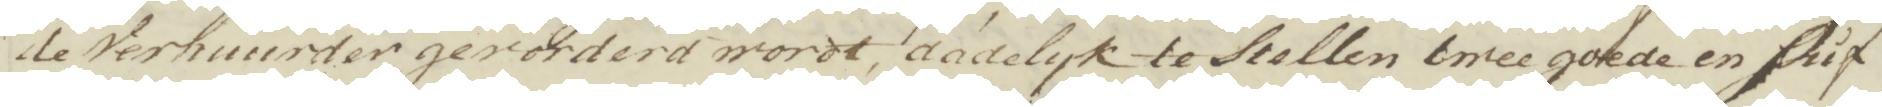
de Verhuurder gevorderd wordt, dadelyk te stellen twee goede en suf
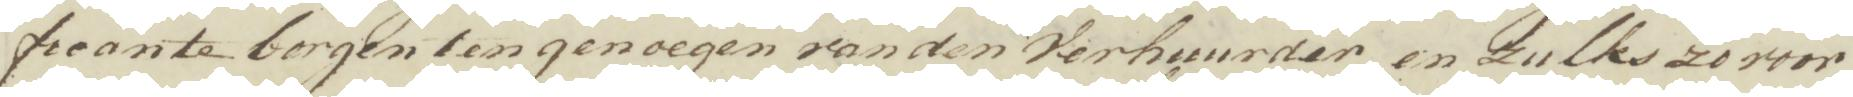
ficante borgen ten genoegen van den Verhuurder, en zulks zo voor
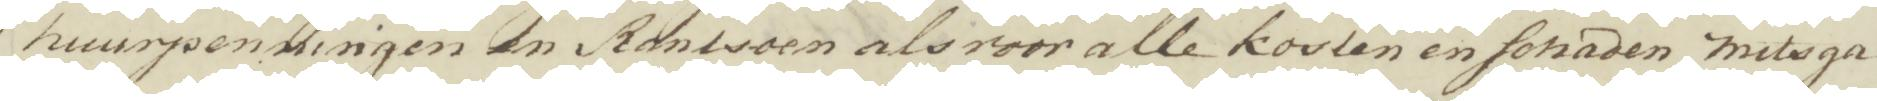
huurpenningen en Rantsoen als voor alle kosten en schaden, mitsga
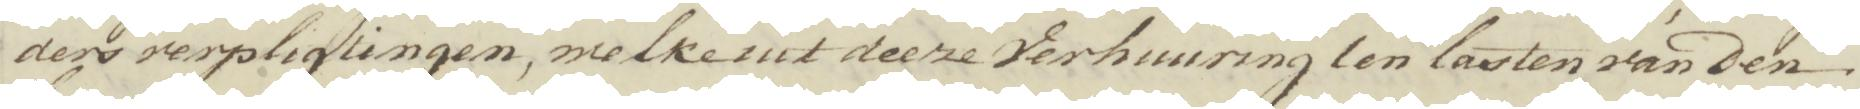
ders verpligtingen, welke uit deeze Verhuuring ten lasten van den
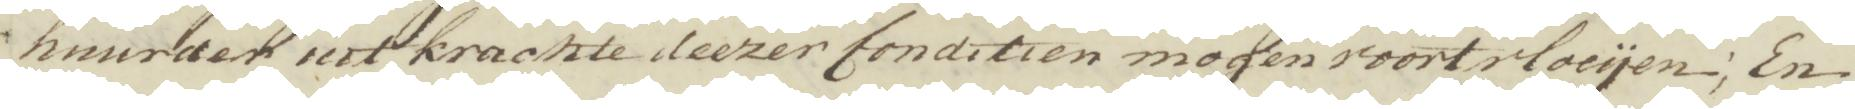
huurder uit krachte deezer Conditien mogen voortvloeijen; En
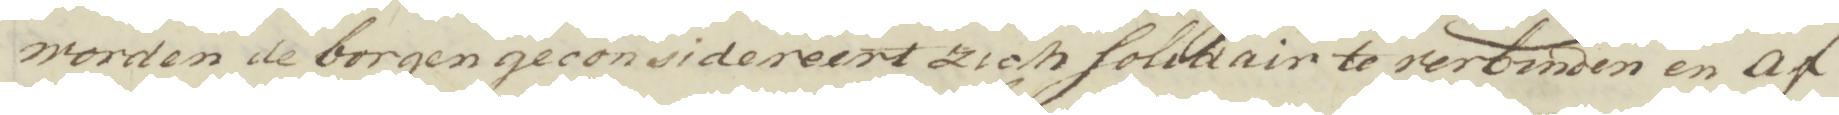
worden de borgen geconsidereert zich solidair te verbinden en af
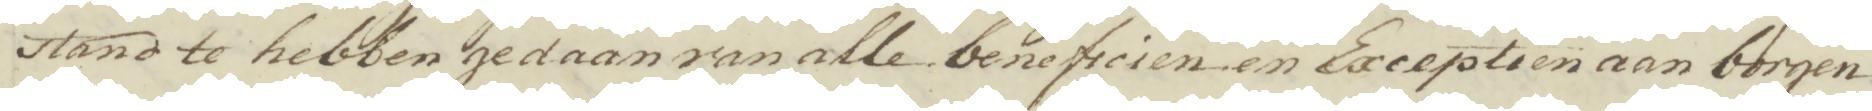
stand te hebben gedaan van alle beneficien en Exceptien aan borgen
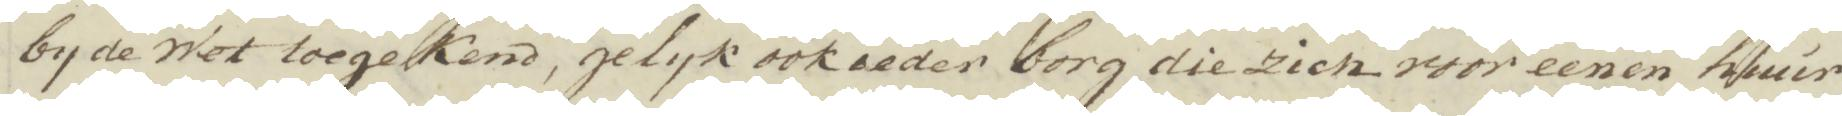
by de wet toegekend, gelyk ook ieder borg die zich voor eenen huur
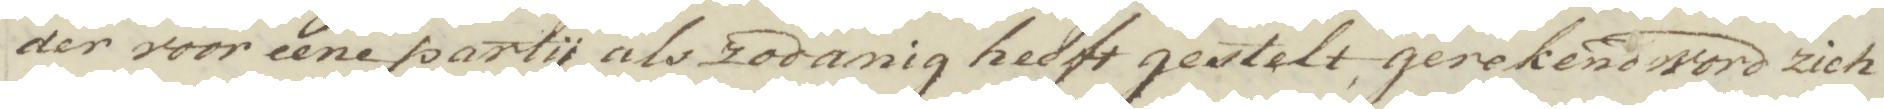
der voor eene partij als zodanig heeft gestelt, gerekend word zich
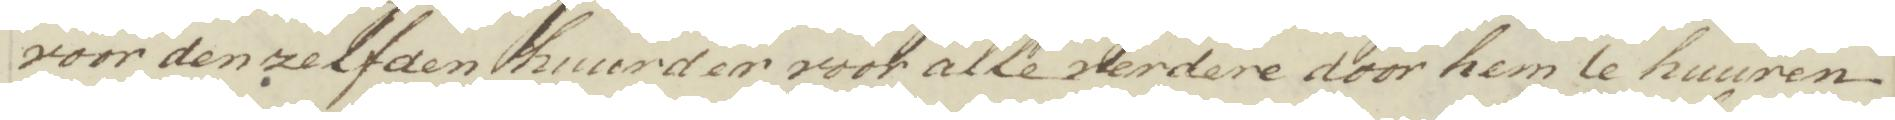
voor den zelfden huurder voor alle verdere door hem te huuren
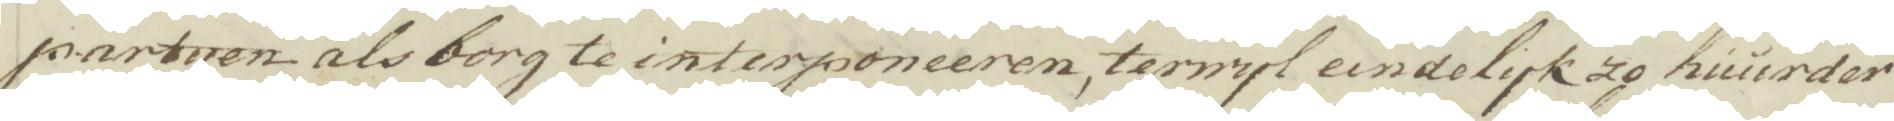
partyen als borg te interponeeren, terwyl eindelijk zo huurder
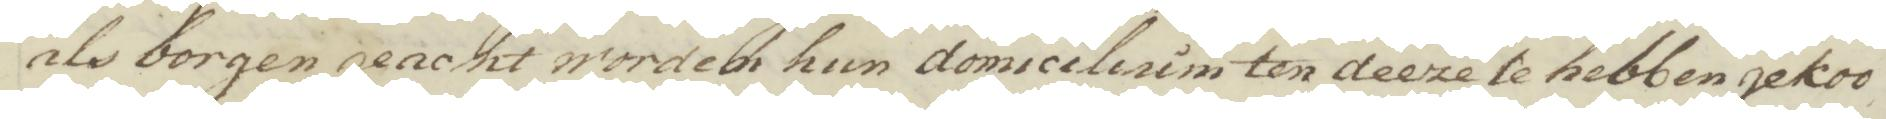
als borgen geacht worden hun domicilium ten deeze te hebben gekoo
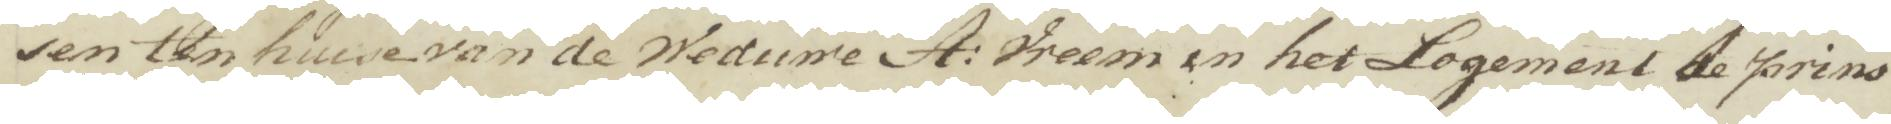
sen ten huise van de weduwe A: Vreem in het Logement de prins
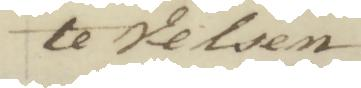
te Velsen
